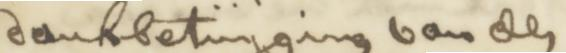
dankbetuijging van den
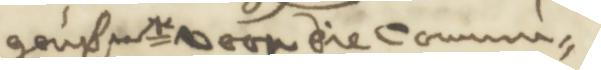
gouvern=r voor die commu„
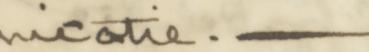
nicatie.—
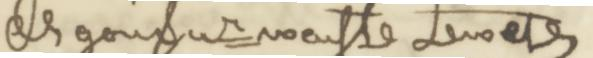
den gouvern=r wenste teweten
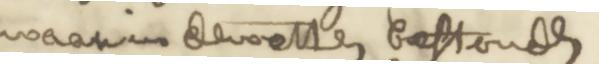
waarin dewetten bestonden
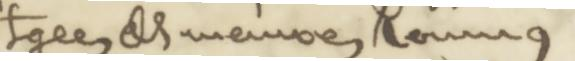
’tgeen den nieuwen koning
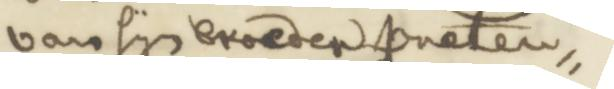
van sijn broeder preten„
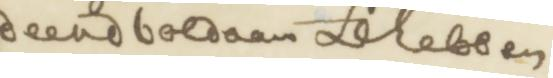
deerd voldaan te hebben
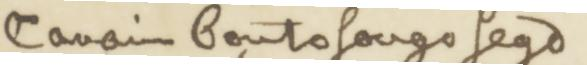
Corain bonto songo segd
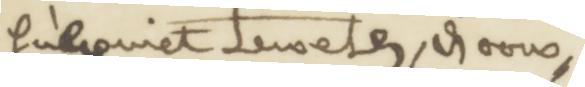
sulx niet teweten, en oor„
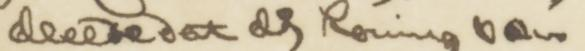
deelde dat den koning van
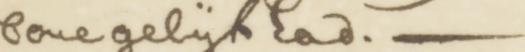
bone gelijk had. —
